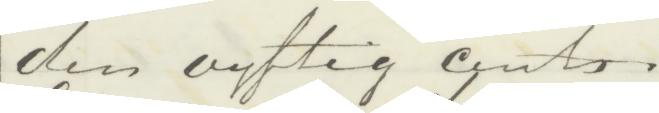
den vyftig cents
